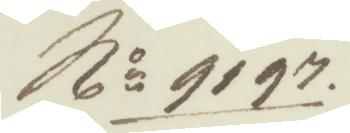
N=o 9197.
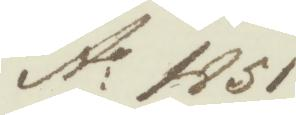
A:o 1851
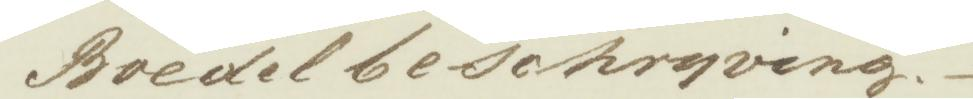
Boedel beschryving.
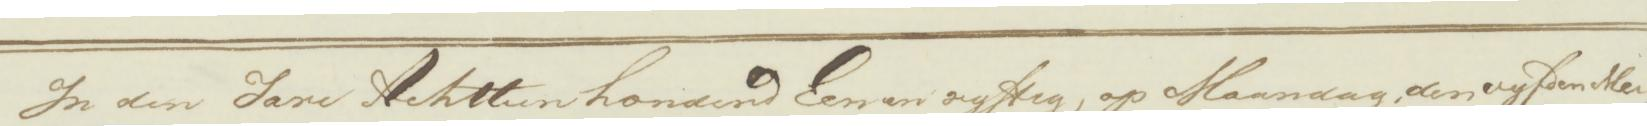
In den Jare Achttien honderd Een en vyftig, op Maandag den vyfden Mei
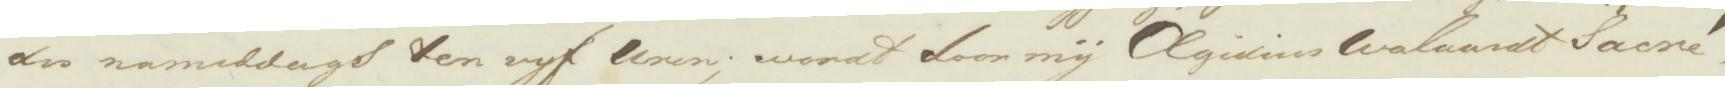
des namiddags ten vyf Uren; wordt door my AEgidius Walaardt Sacré
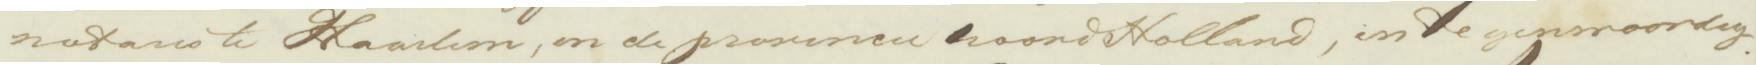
notaris te Haarlem, in de provincie noord Holland, in tegenwoordig.
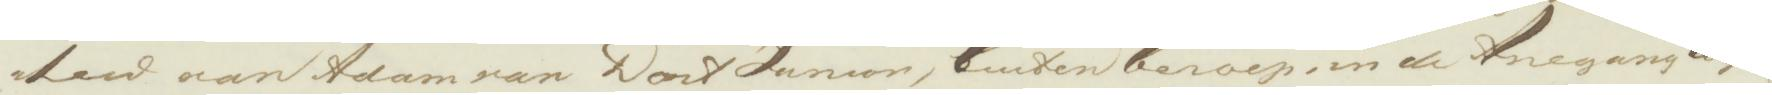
„heid aan Adam van Dort Iunior, buiten beroep, in de Anegang wyk
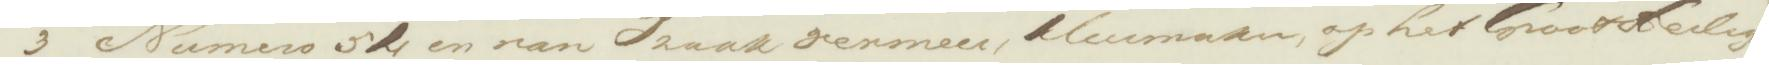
3 Numero 52 en van Izaak vermeer, kleermaker, op het Groot Heilig
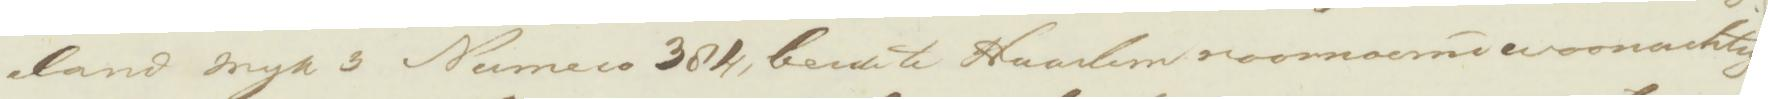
land wyk 3 Numero 384, beide te Haarlem voornoemd woonachtig
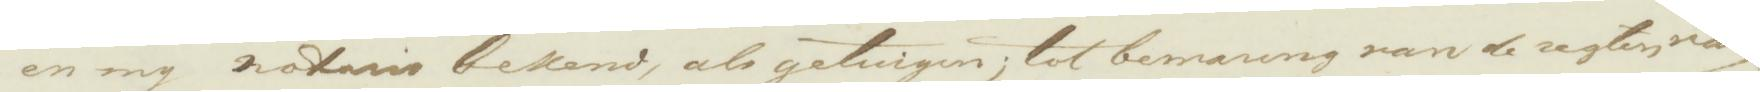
en my notaris bekend, als getuigen; tot bewaring van de regten van
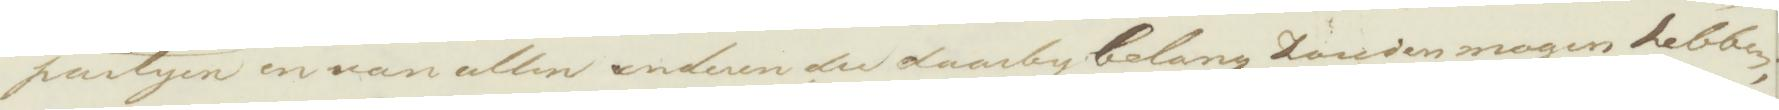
partyen en van allen anderen die daarby belang zouden mogen hebben,
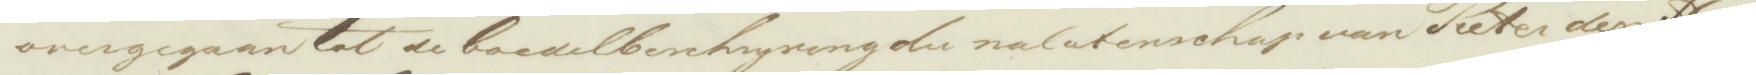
overgegaan tot de boedelbeschryving der nalatenschap van Pieter den Har
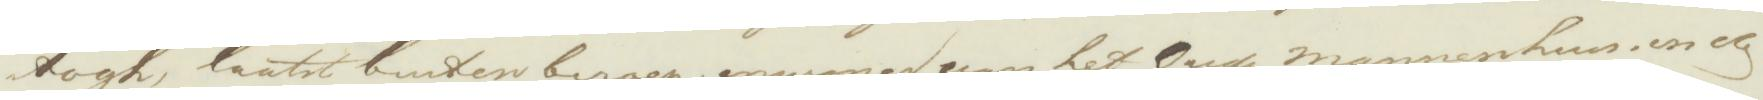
togh, laatst buiten beroep, inwoner aan het Oude mannenhuis, in de
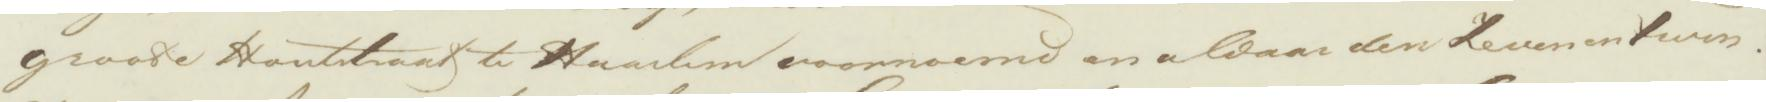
groote Houtstraat te Haarlem voornoemd en aldaar den Zeven en twin
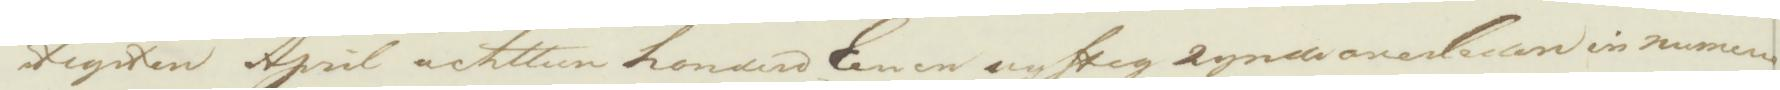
tigsten April achttien honderd Een en vyftig zynde overleden in numero
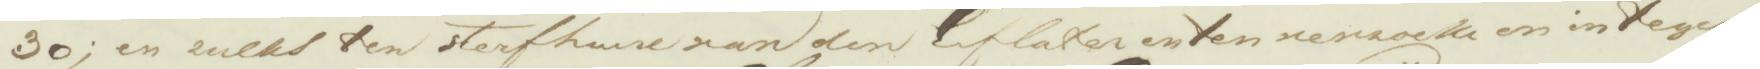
30; en zulks ten sterfhuize van den Erflaten en ten verzoeke en in tegen
